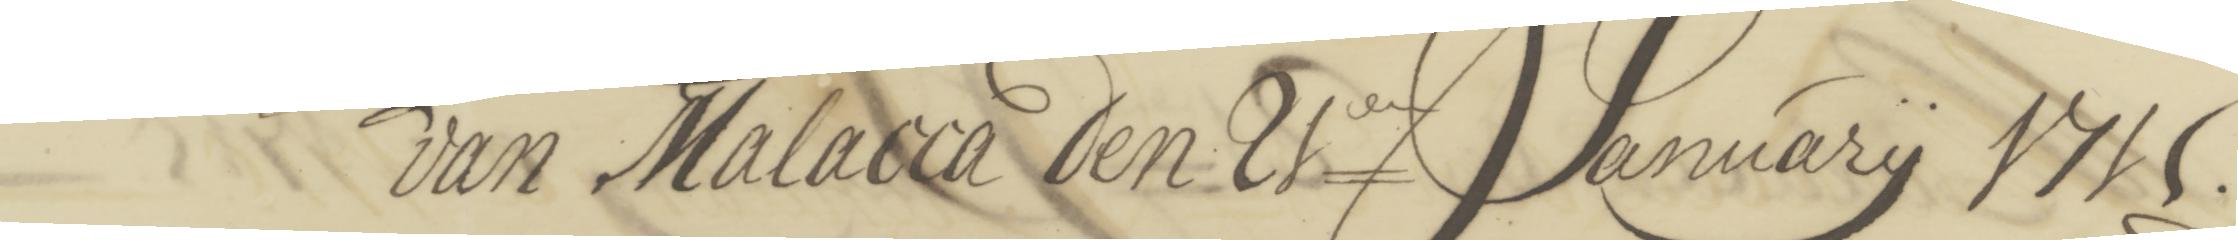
Van Malacca den 21=en Ianuarij 1715.
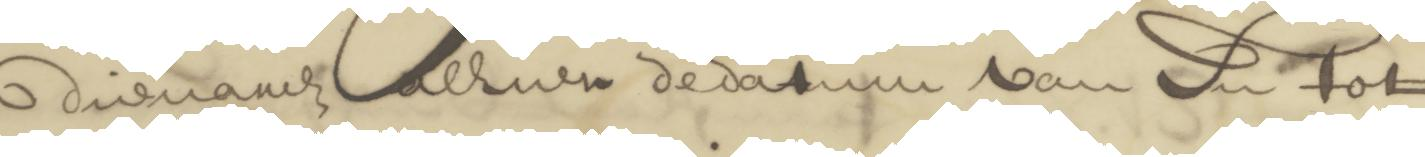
dienaren alhier de datum van En tot
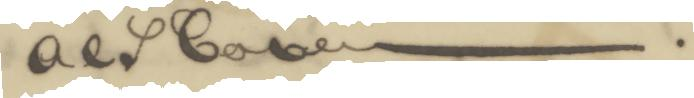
als boven.
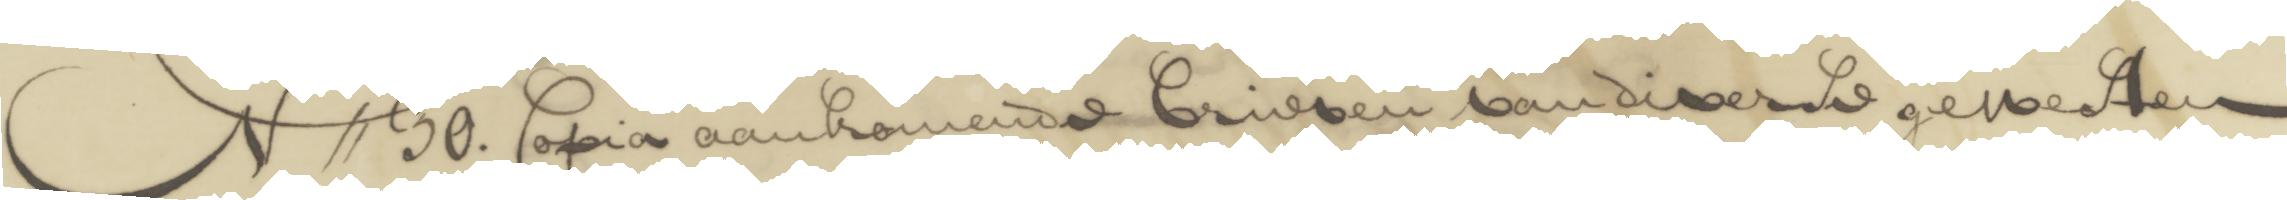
N„o 30. Copia aankomende brieven van diverse gewesten
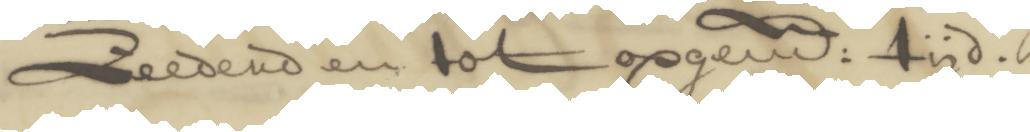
Zeederd en tot opgem: tijd.
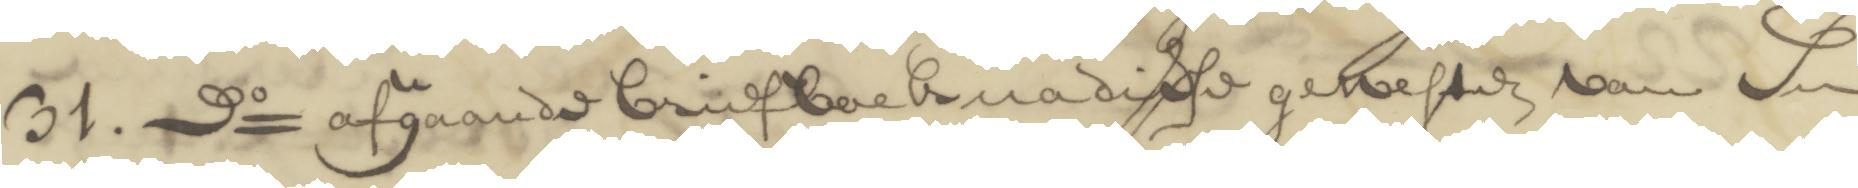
31. D=o afgaande briefboek na diverse gewesten van En
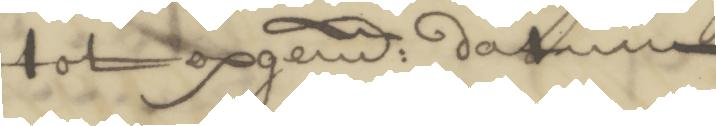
tot opgem: datum
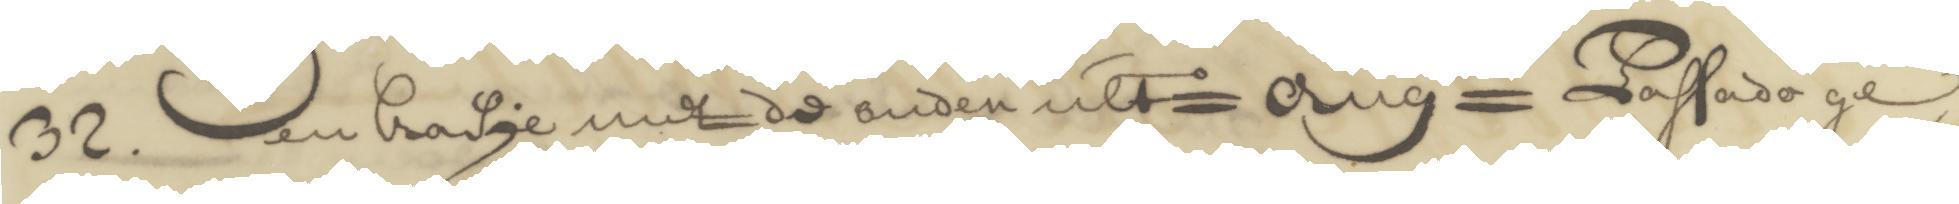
32. Een kasje met de onder ult=o aug=mo Passado ge
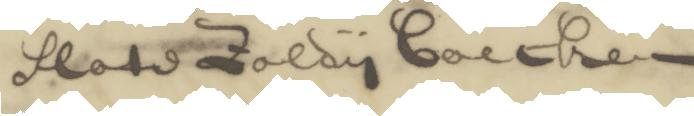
slote Zoldij boecken
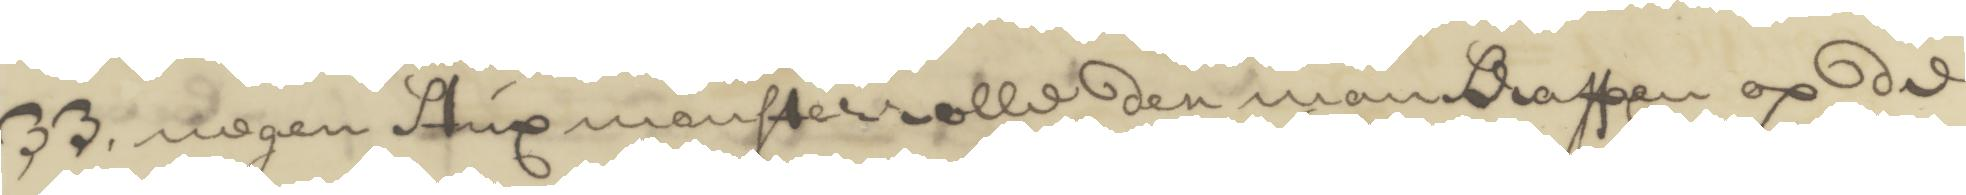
33. negen Stux monsterrolle der manschappen op de
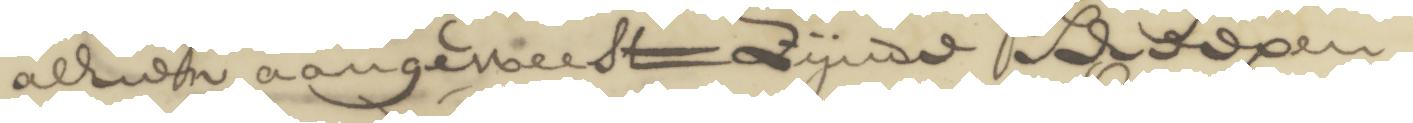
alhier aangeweest Zijnde Scheepen
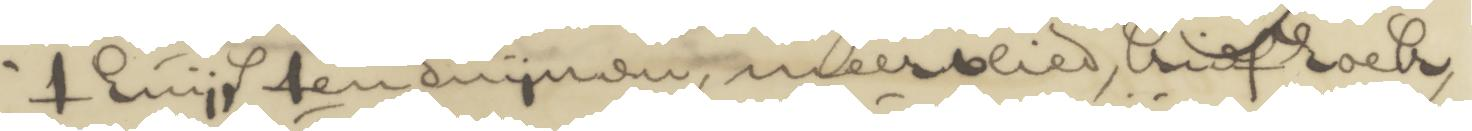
't huijs ten duijnen, meervlied, kiefhoek,
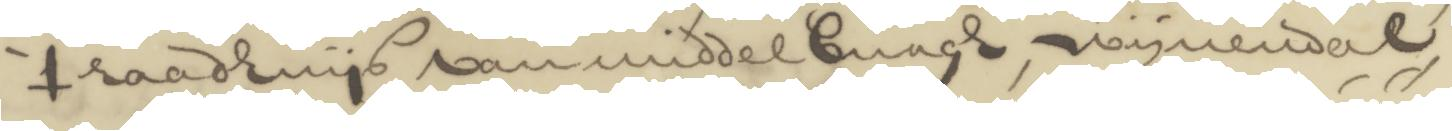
’t raadhuijs van middelburgh, wijnendal,
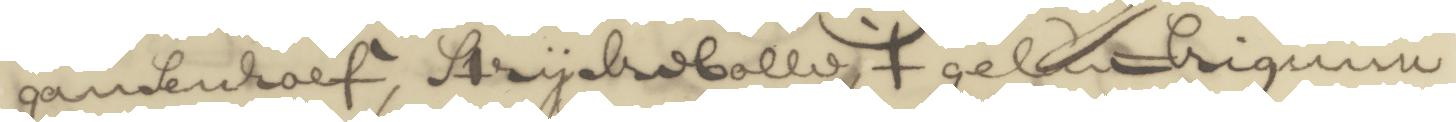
gansenhoef, Strijckebolle 't geluckiguur
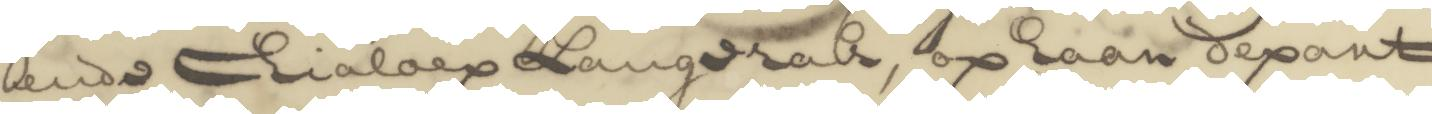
ende Chialoep Langerak, op haar depart
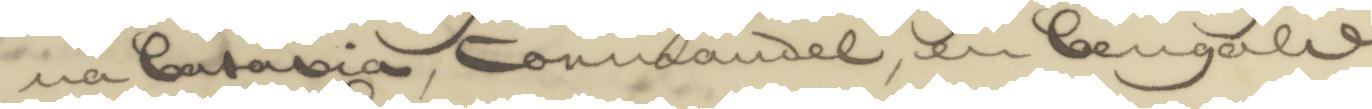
na batavia, Cormandel, en bengale
